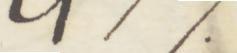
477.
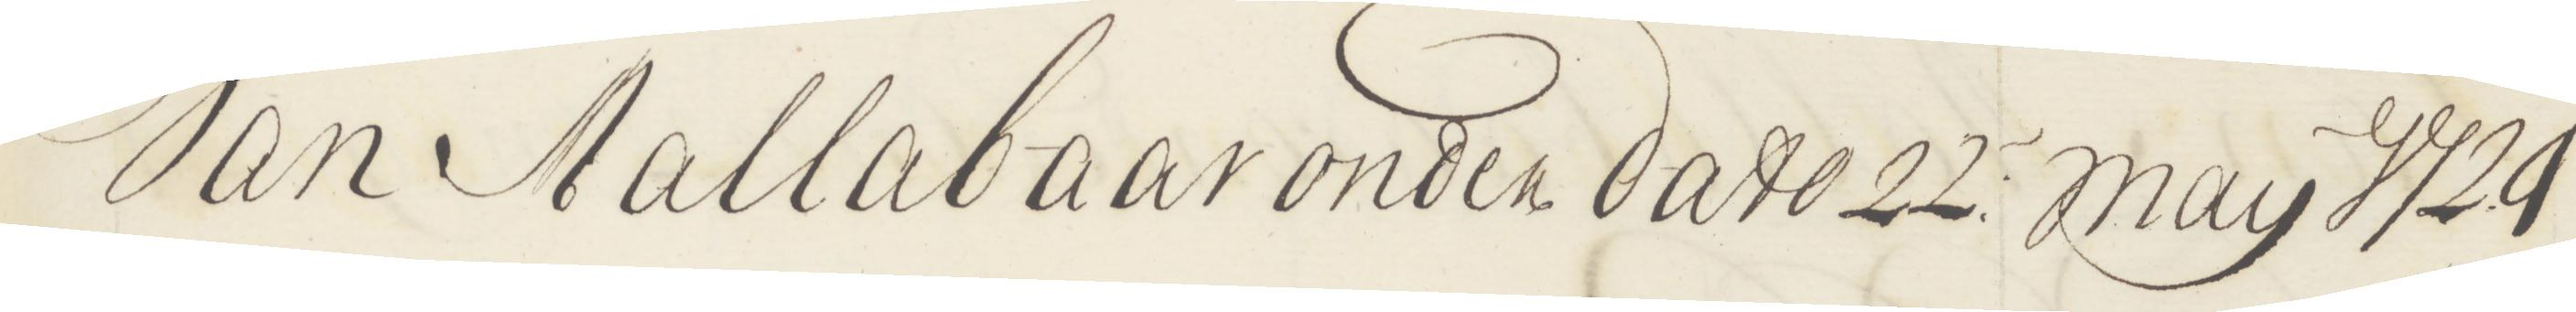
Van Mallabaar onder dato 22:' may 1724
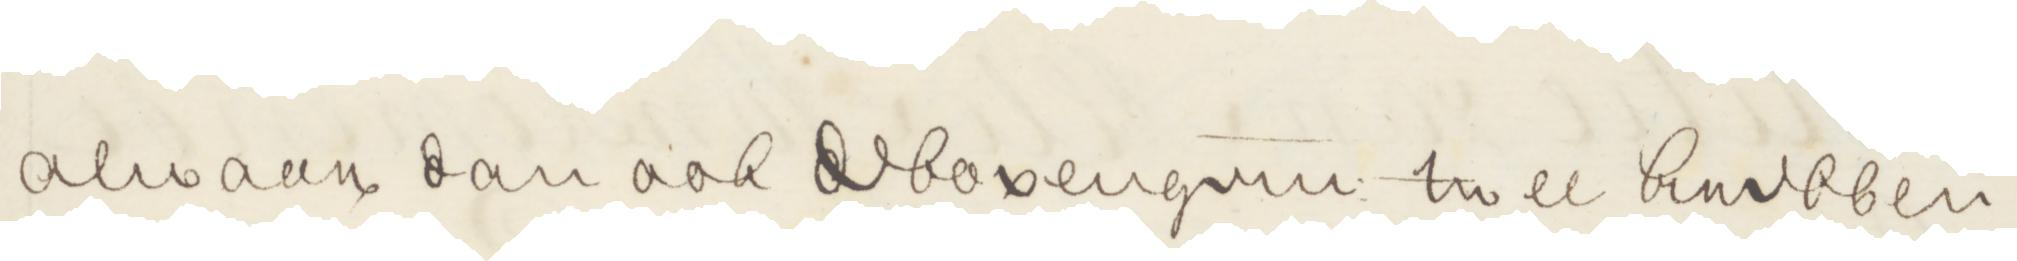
alwaar dan ook de bovengem: twee krebben
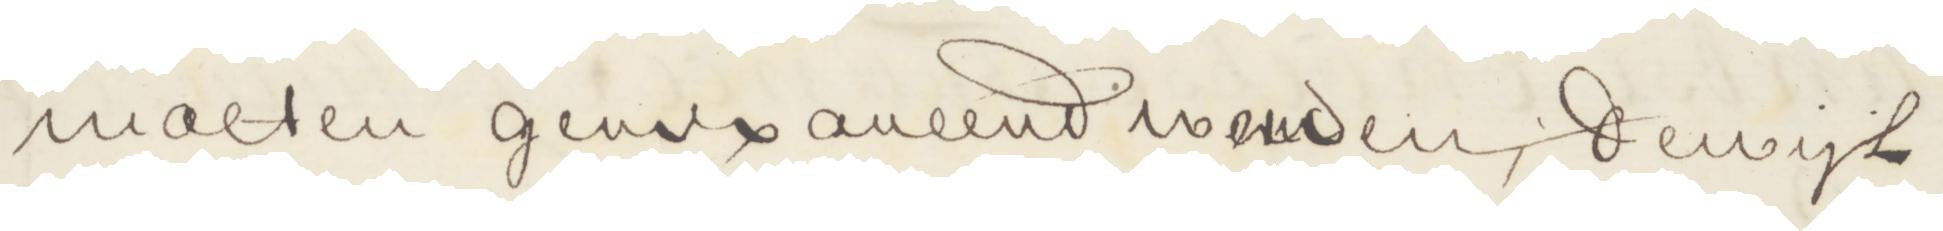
moeten gerepareerd werden, dewijl
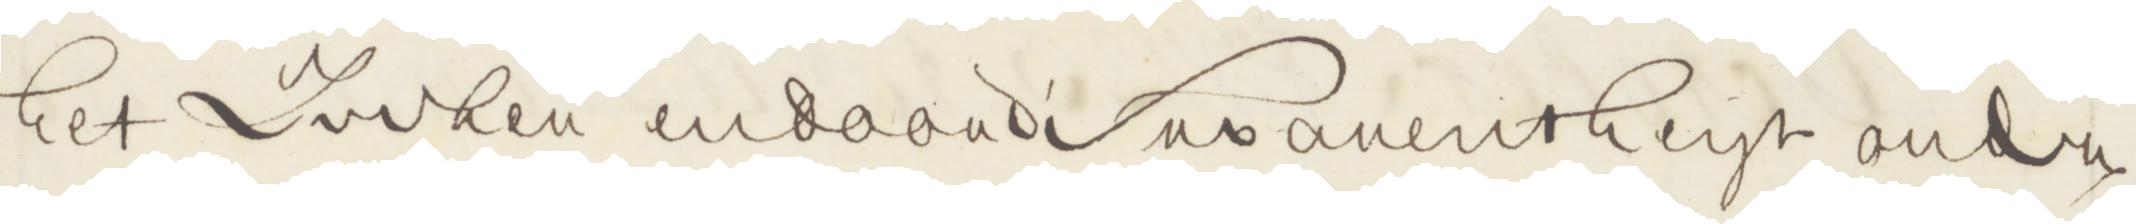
het zeeker en door d'Ervarentheijt onder
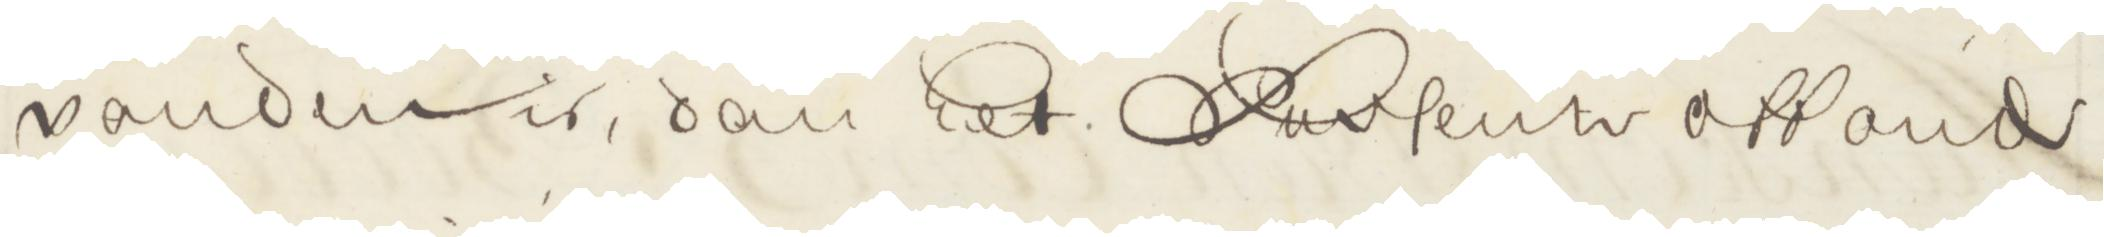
vonden is, dan het Presente off oude
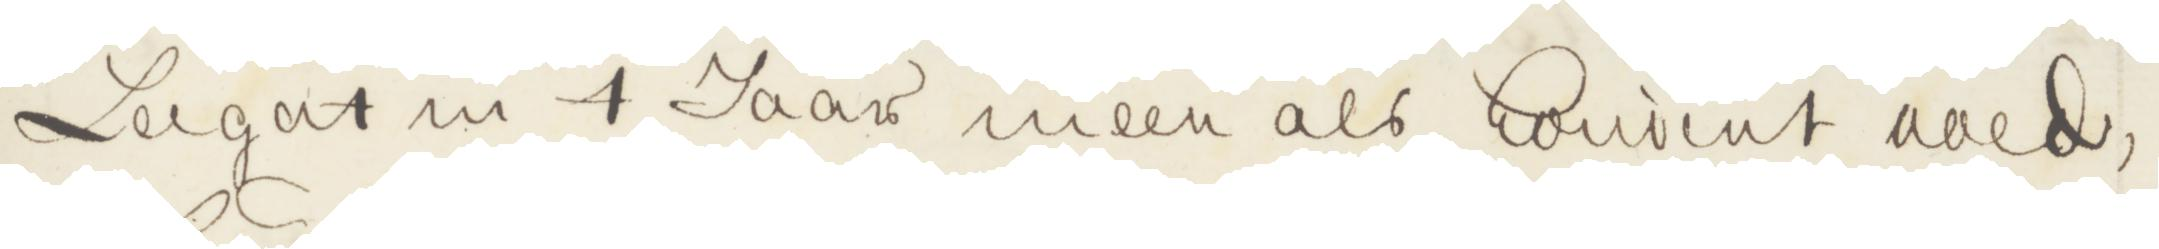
zeegat in ’t Iaar meer als hondert roede,
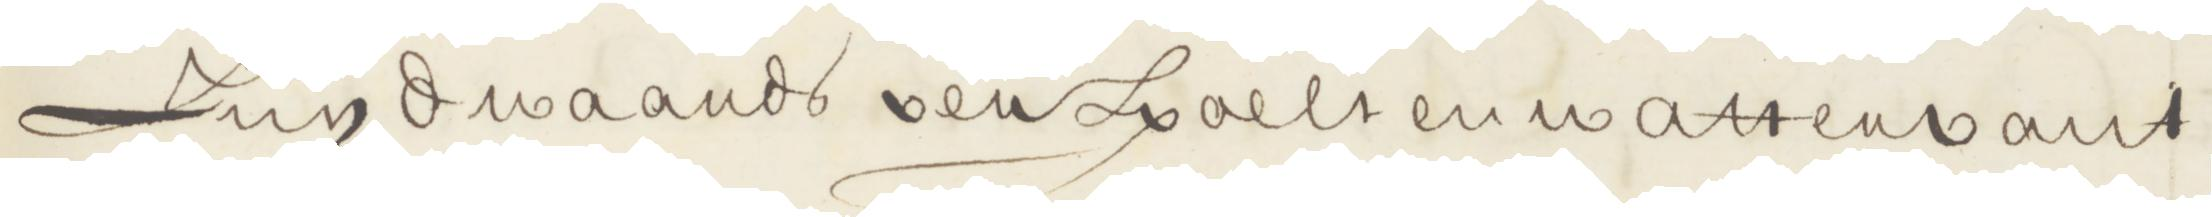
zuydwaards verspoelt en watter van’t
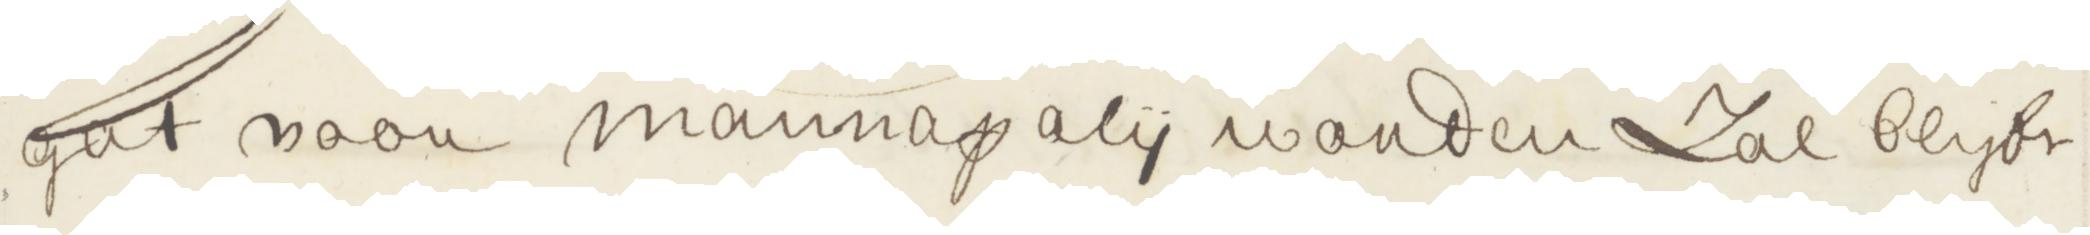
gat voor mannapalij worden zal blijft
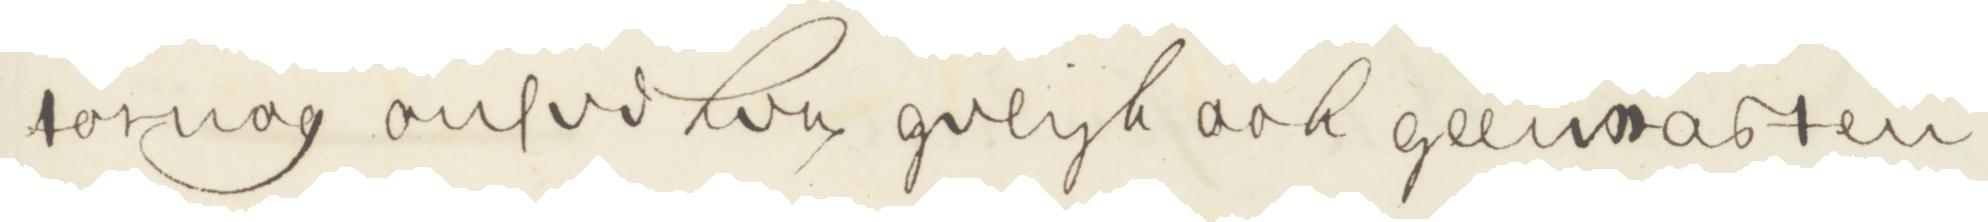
tot nog onseeker gelijk ook geen vasten
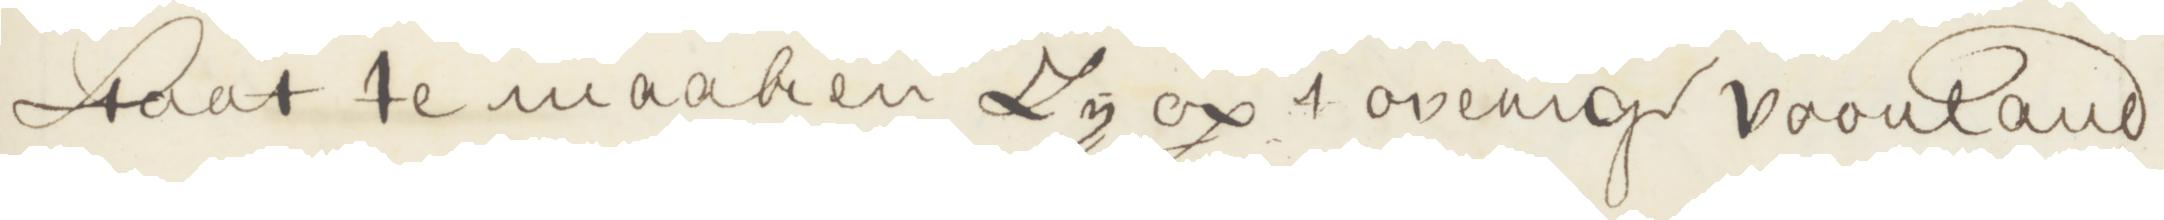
staat te maaken zij op t overige voorland
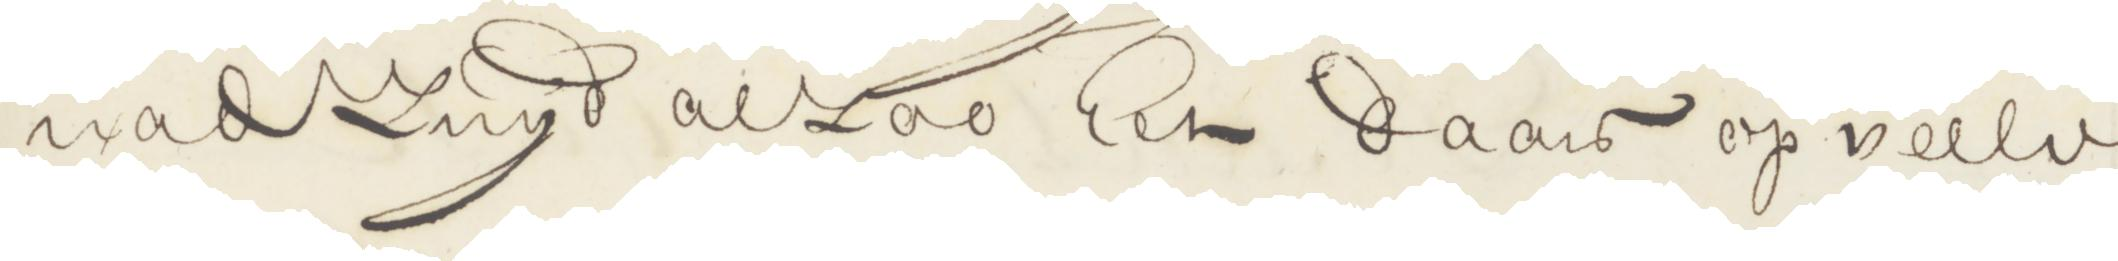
nade zuyd alzoo het daars op veele
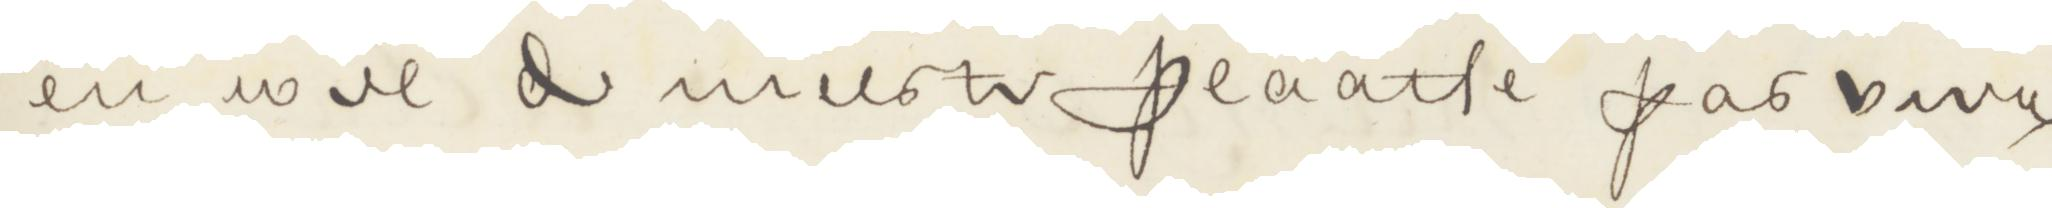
en wel de meeste plaatse pas vier
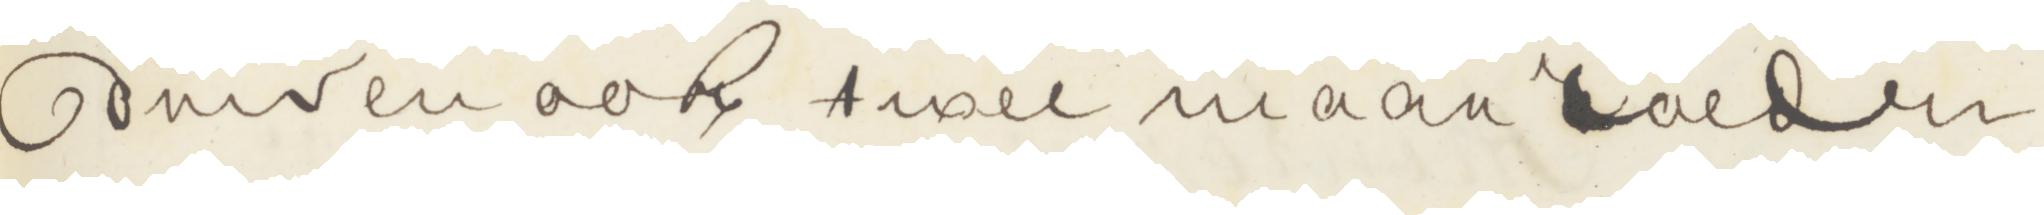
drie en ook twee maar roeden
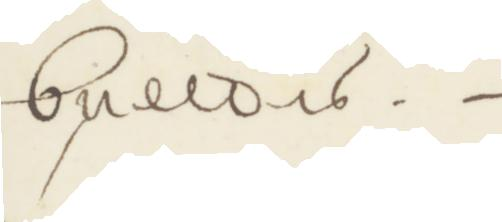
breed is. –
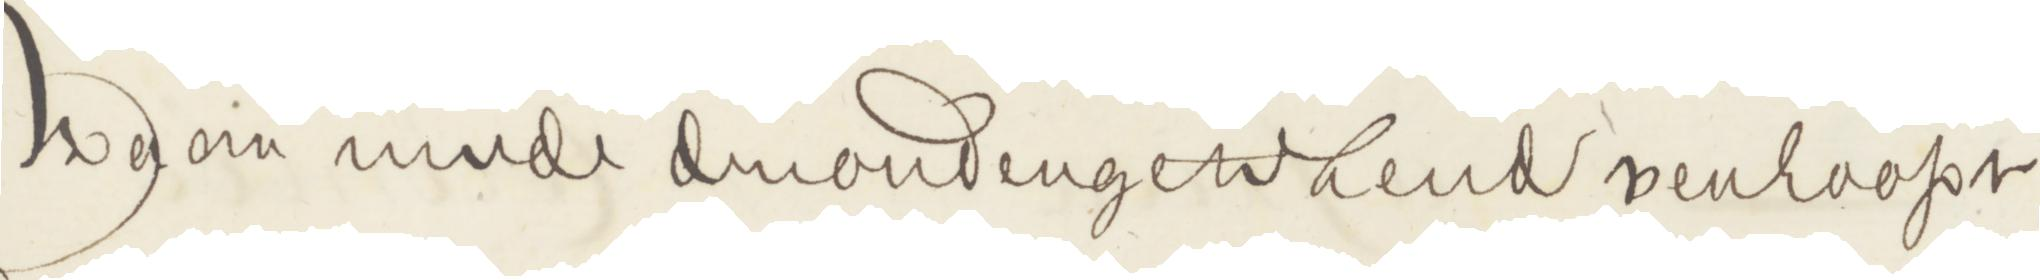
Waar mede den ondergetekende verhoopt
